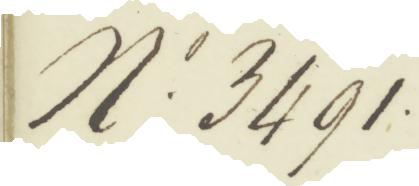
N:o 3491.
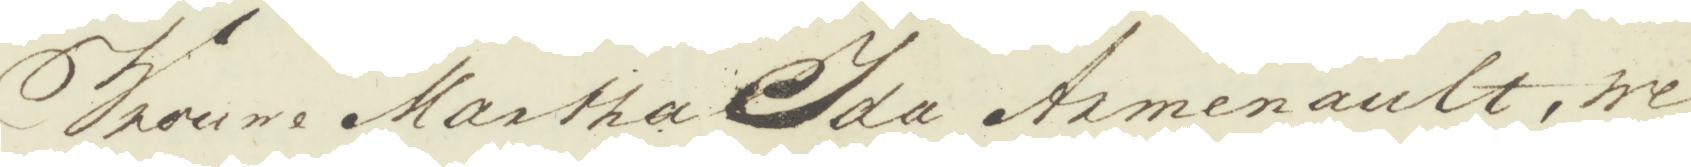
Vrouwe Martha Ida Armenault, we
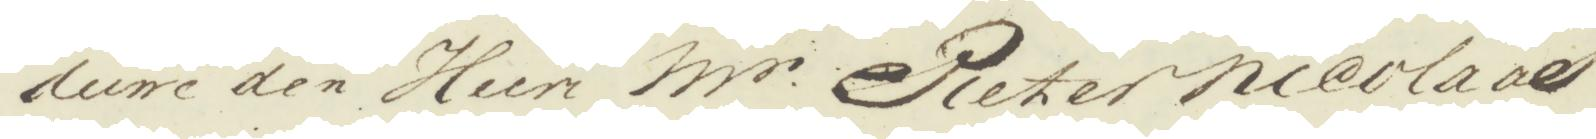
duwe den Heere M.r Pieter nicolaas
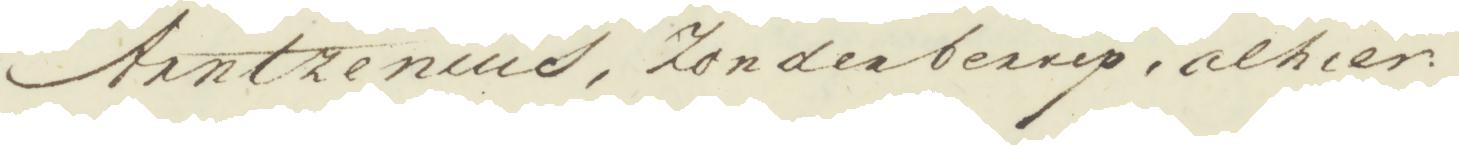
Arntzenius, zonder beroep, alhier.
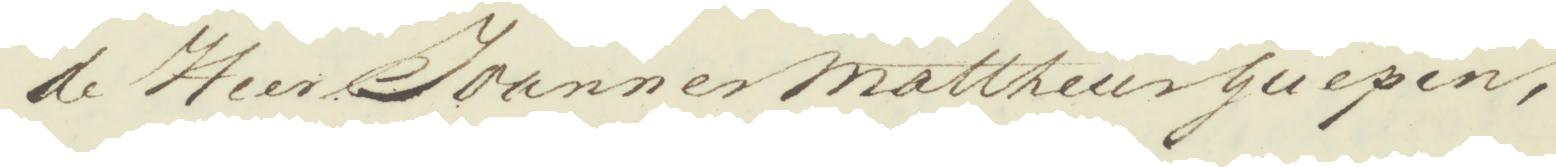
de Heer Ioannes Mattheus Guepin,
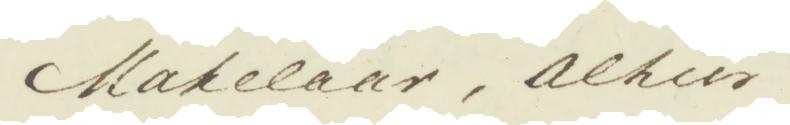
Makelaar, alhier
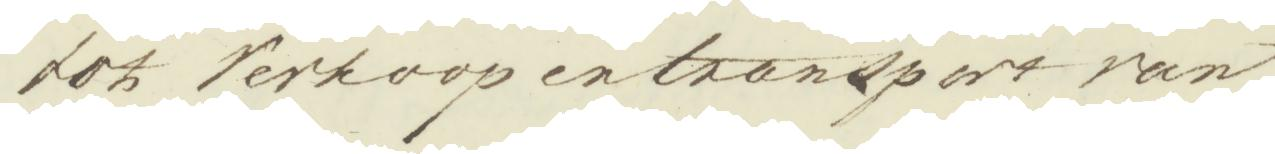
tot Verkoop en transport van
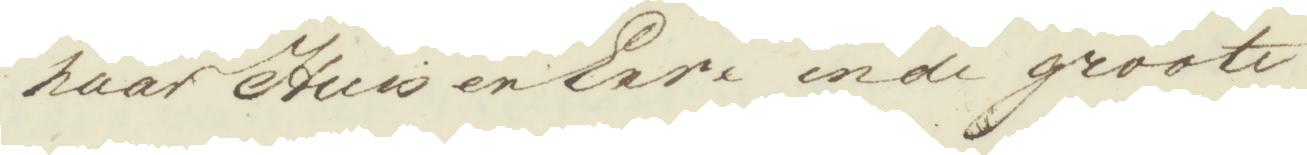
haar Huis en Erve in de groote
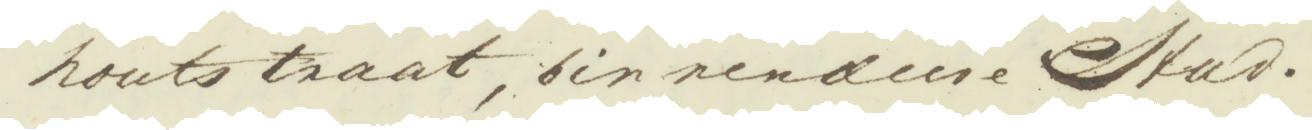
houtstraat, binnen deese Stad.
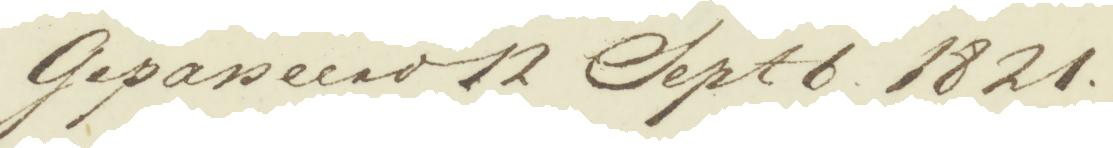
Gepasseerd 12 Septb. 1821.
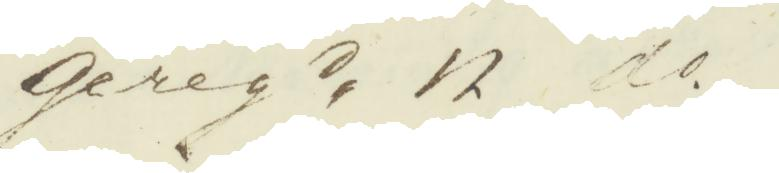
gereg„d 12 do.
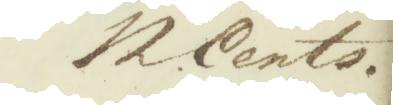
12. Cents.
